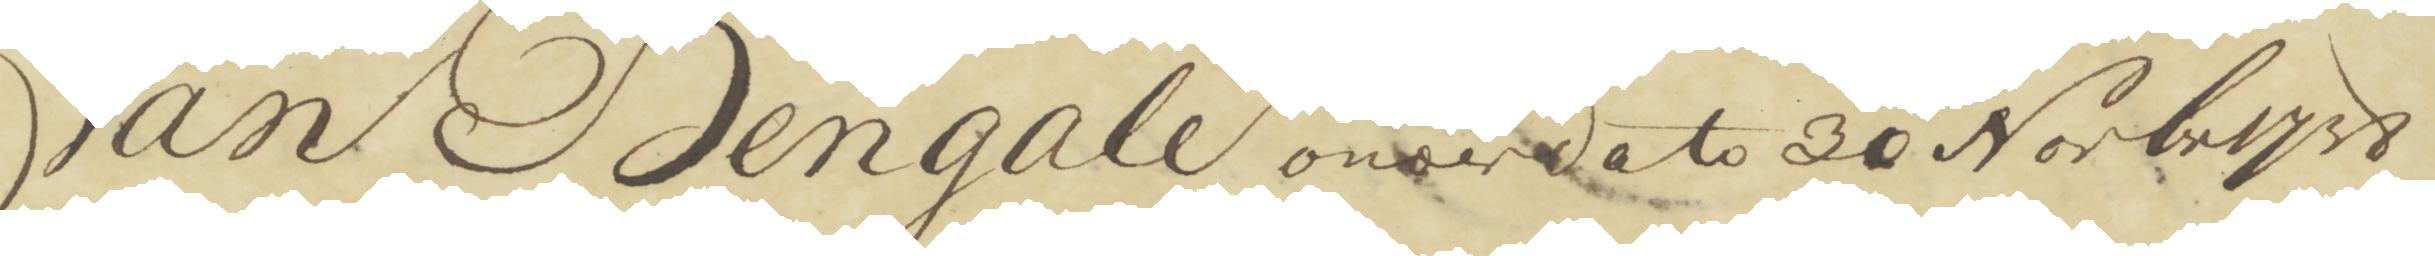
Van Bengale onder dato 30 Novbr 1738
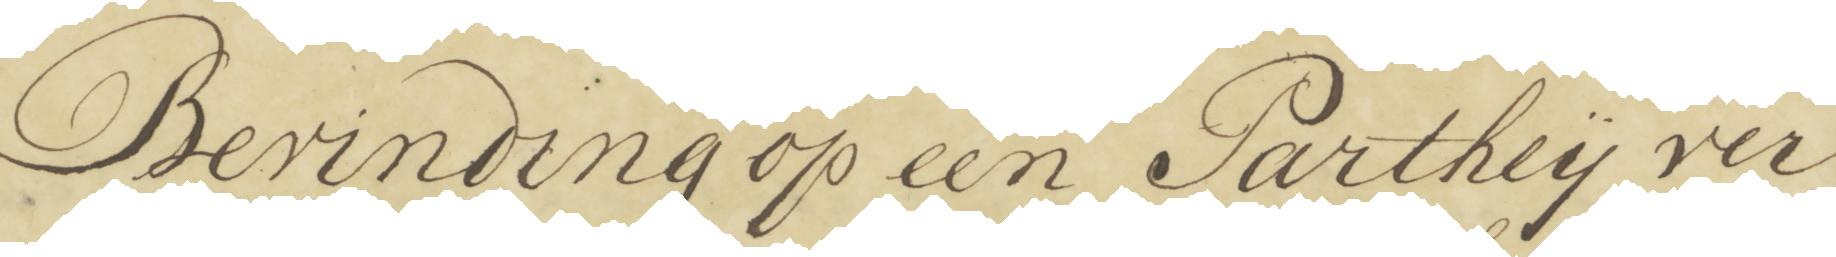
Bevinding op een Partheij ver
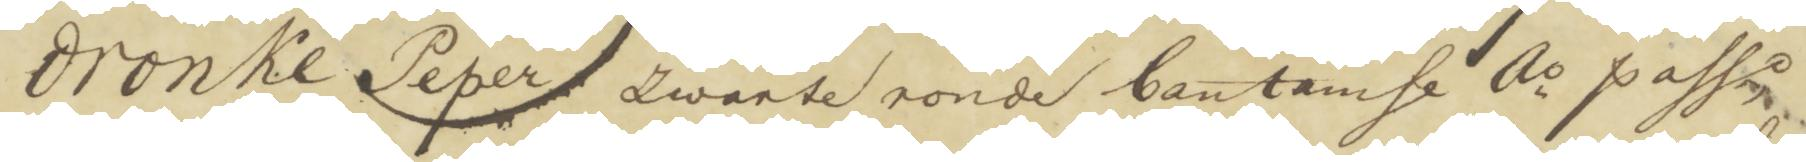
dronke Peper zwarte ronde bantamse A„o pass„o
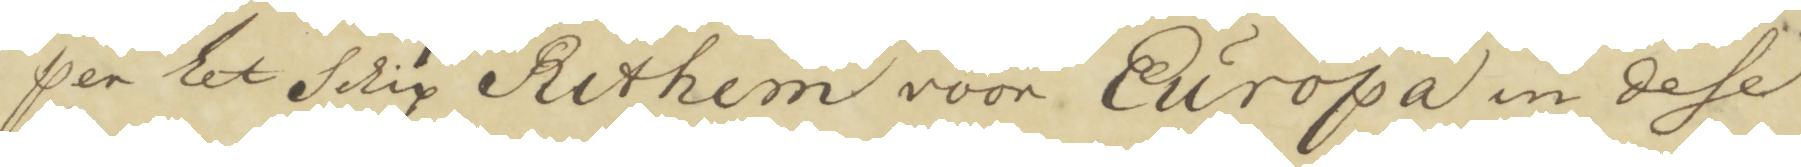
per het schip Rithem voor Europa in dese
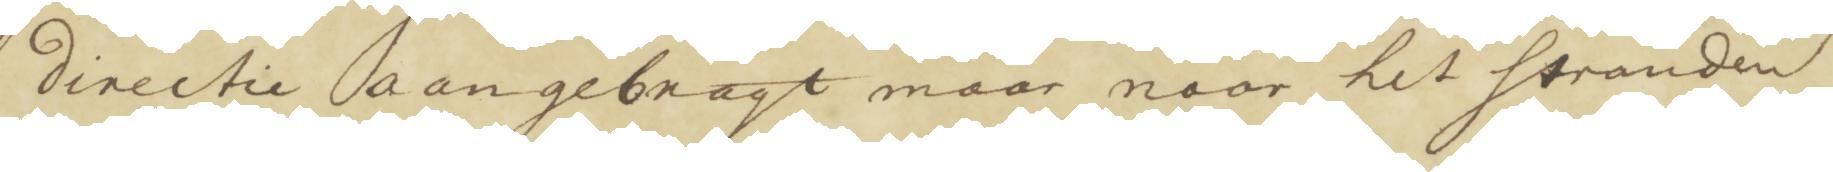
directie aangebragt maar naar het stranden
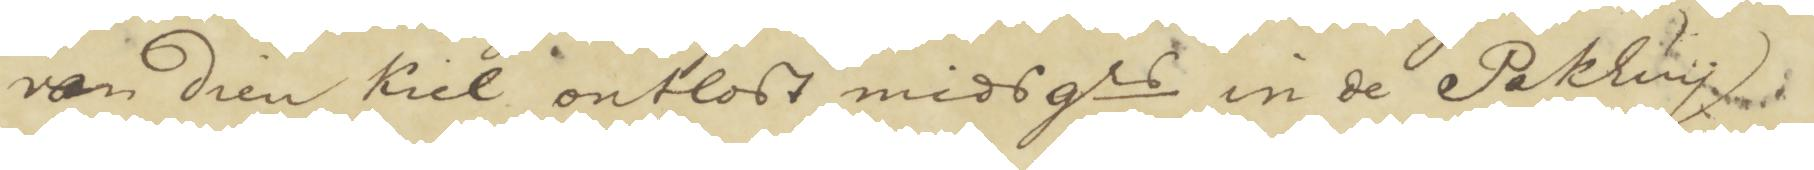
van dien kiel ontlost midsg-rs in de Pakhuij
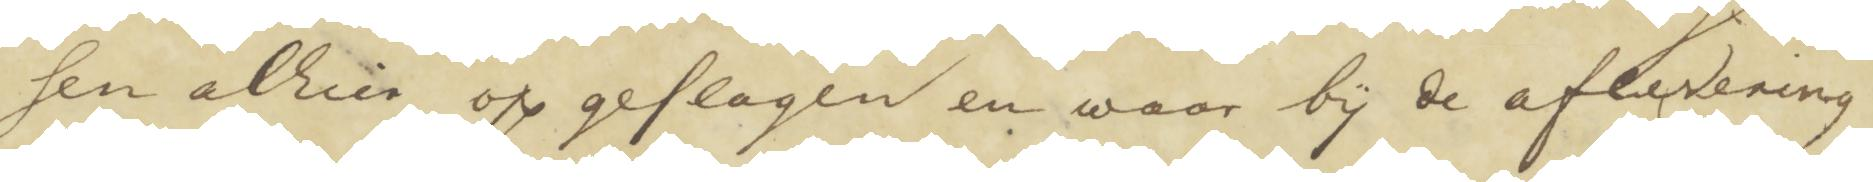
sen alhier op geslagen en waar bij de aflevering
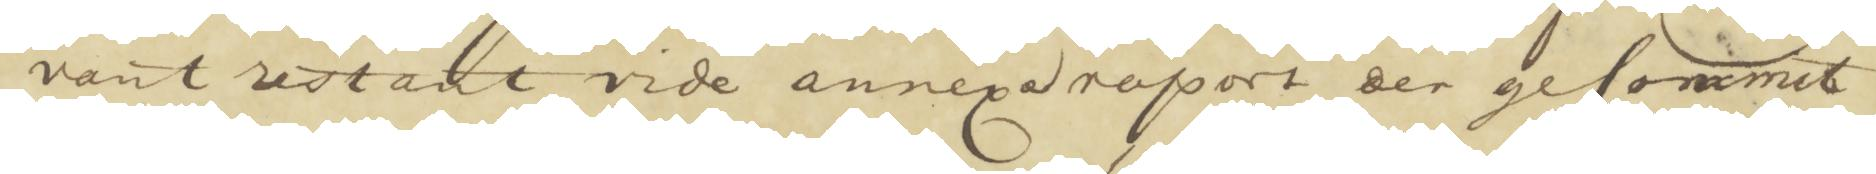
vant restant vide annexa raport der gecommit
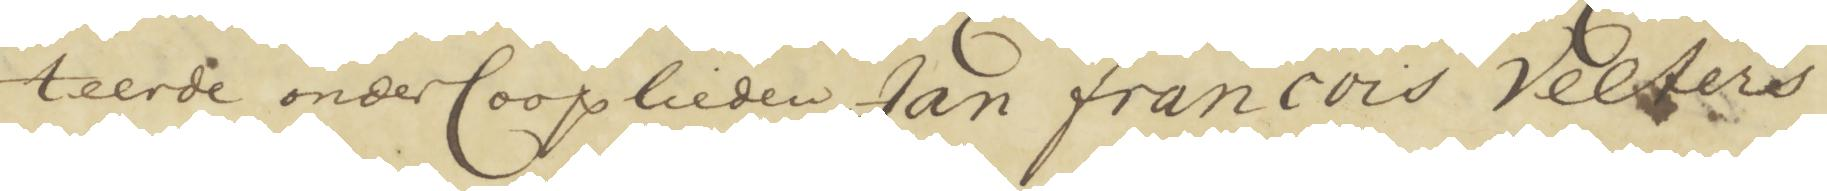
teerde onder Cooplieden Jan francois Velters
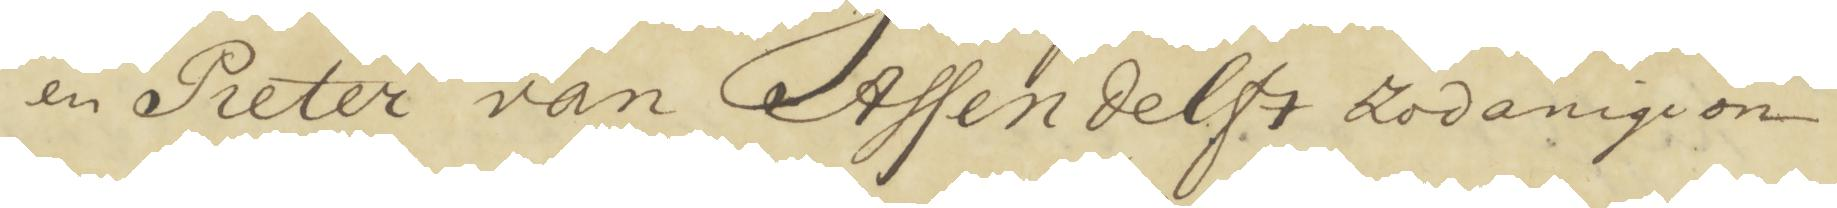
en Pieter van Assendelft zodanige on
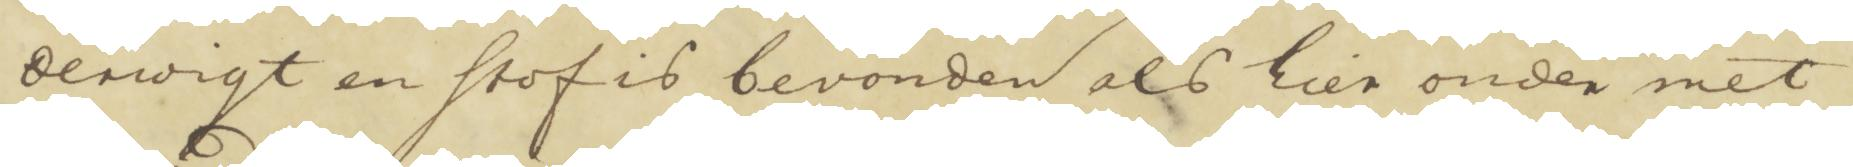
derwigt en stof is bevonden als hier onder met
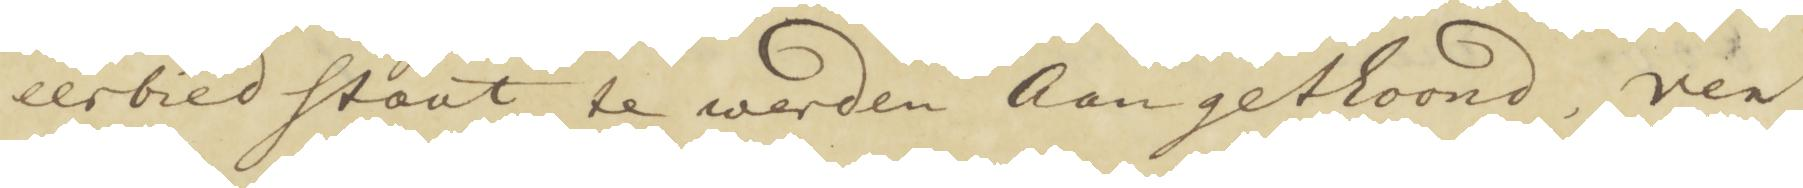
eerbied stont te werden aan gethoond, ver
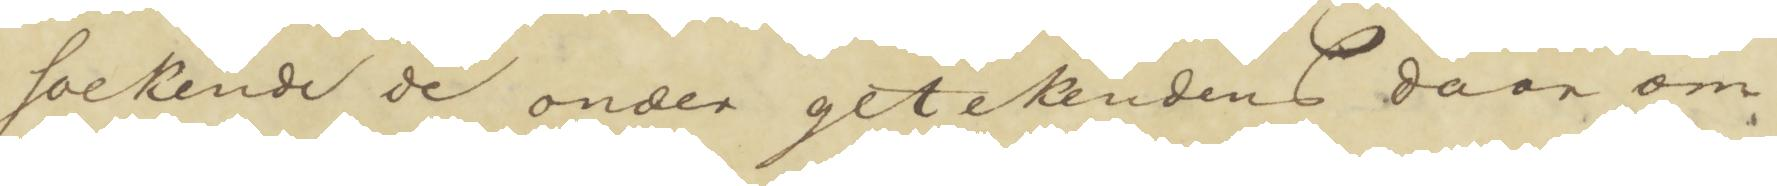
soekende de, onder getekenden daar om
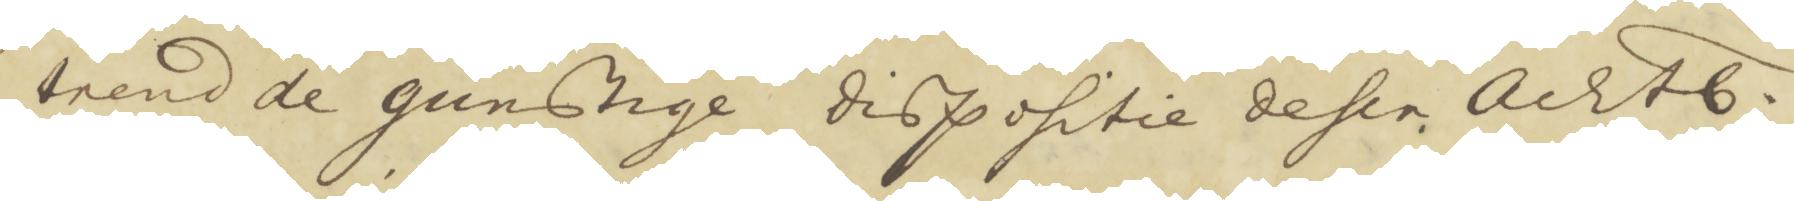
trend de gunstige dispositie deser Achtb:
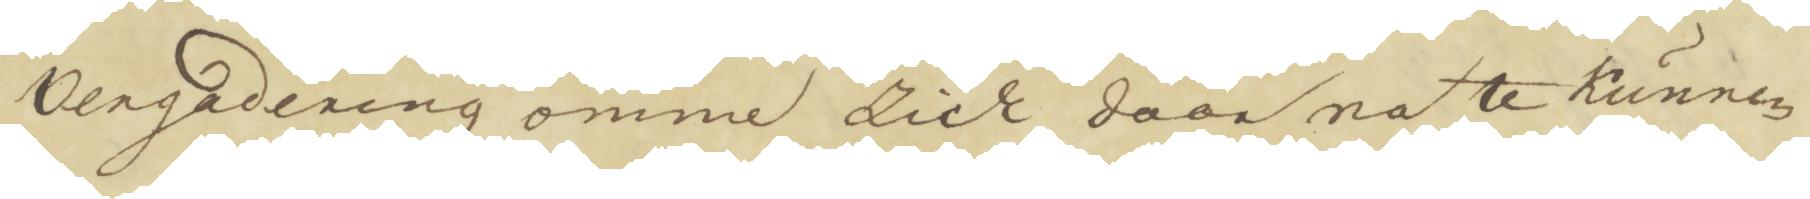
vergadering omme zich daar na te kunnen
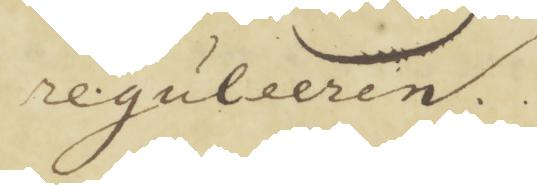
reguleeren.
